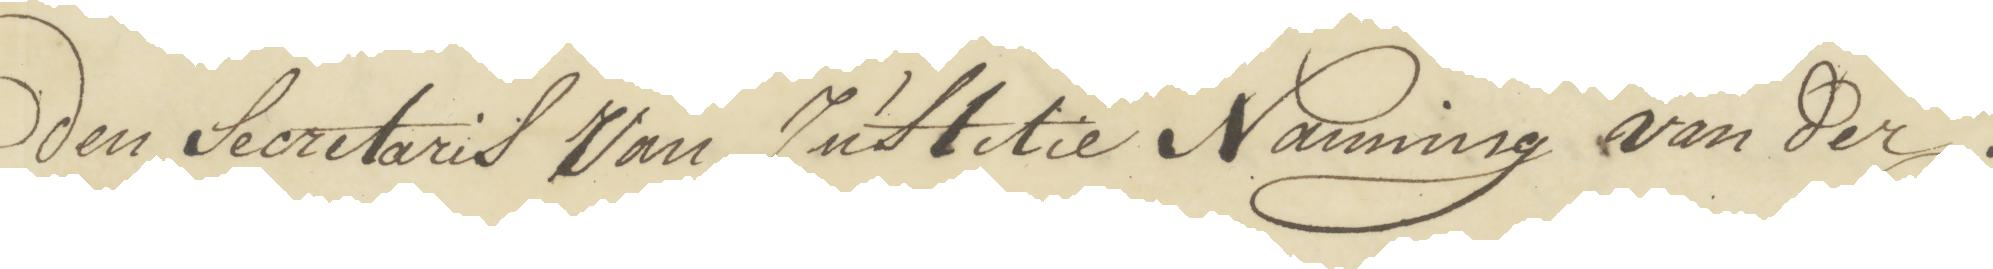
den secretaris van Justitie Nanning van der
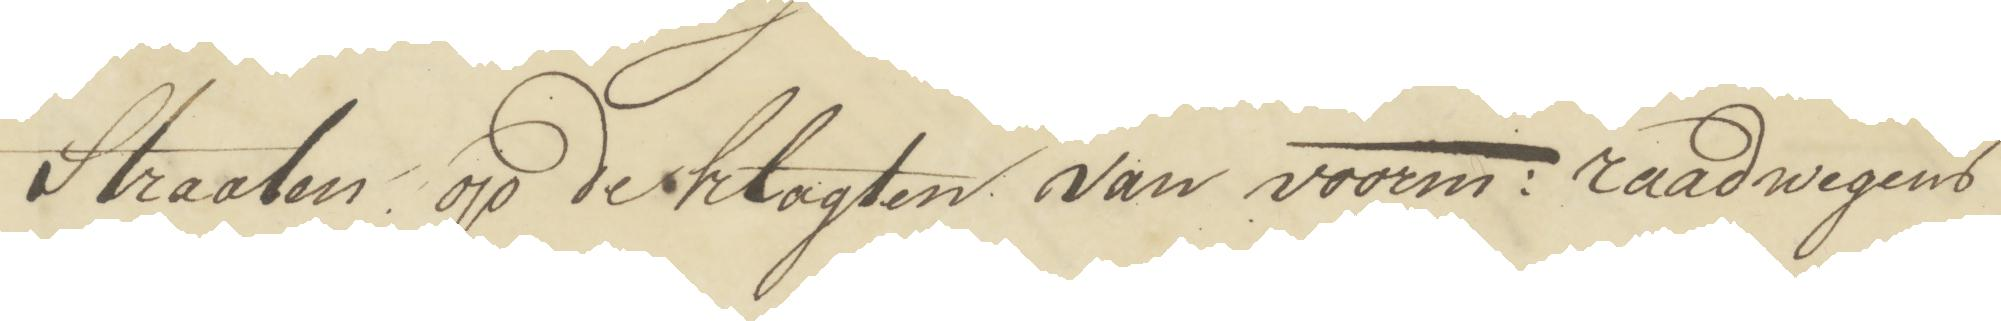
Straaten op de klagten van voorm: raad wegens
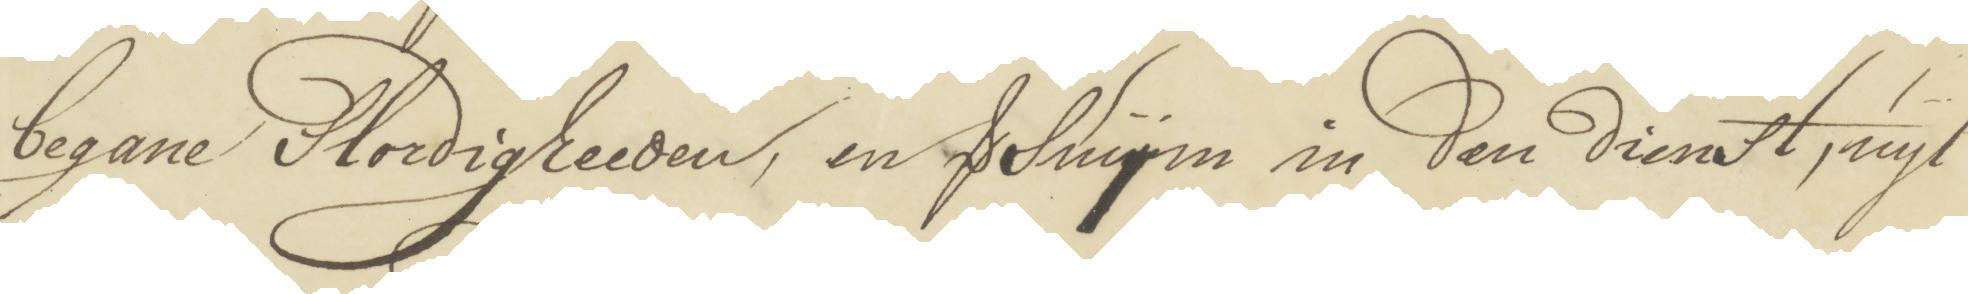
begane slordigheeden, en versuijm in den dienst, uijt
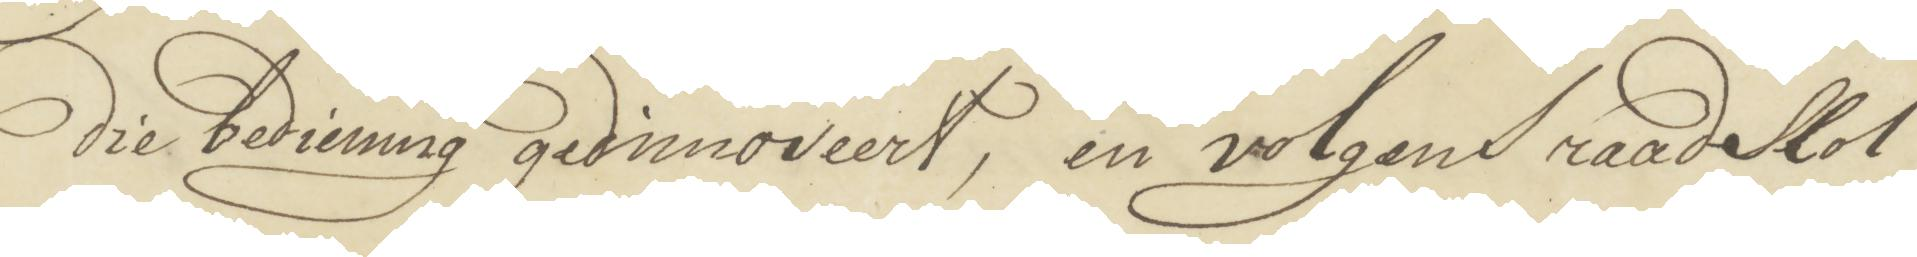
die bediening gedimoveert, en volgens raadslot
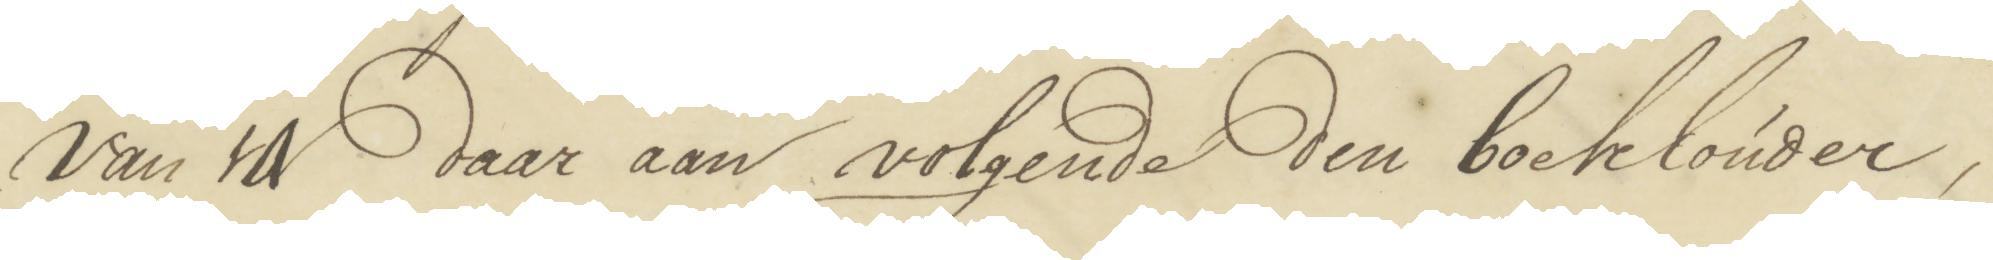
van 14 daar aan volgende den boekhouder,
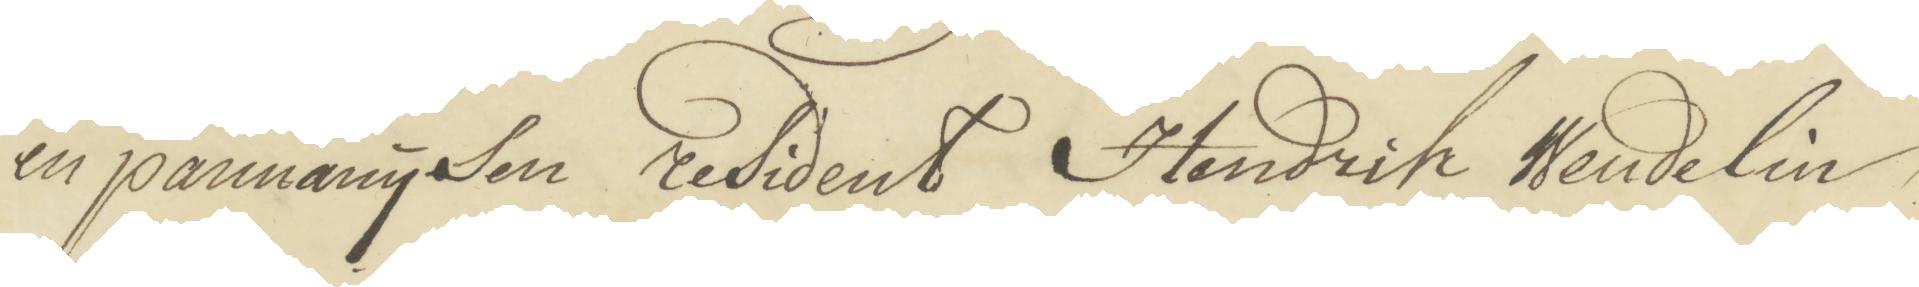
en pannanijsen resident Hendrik Wendelin
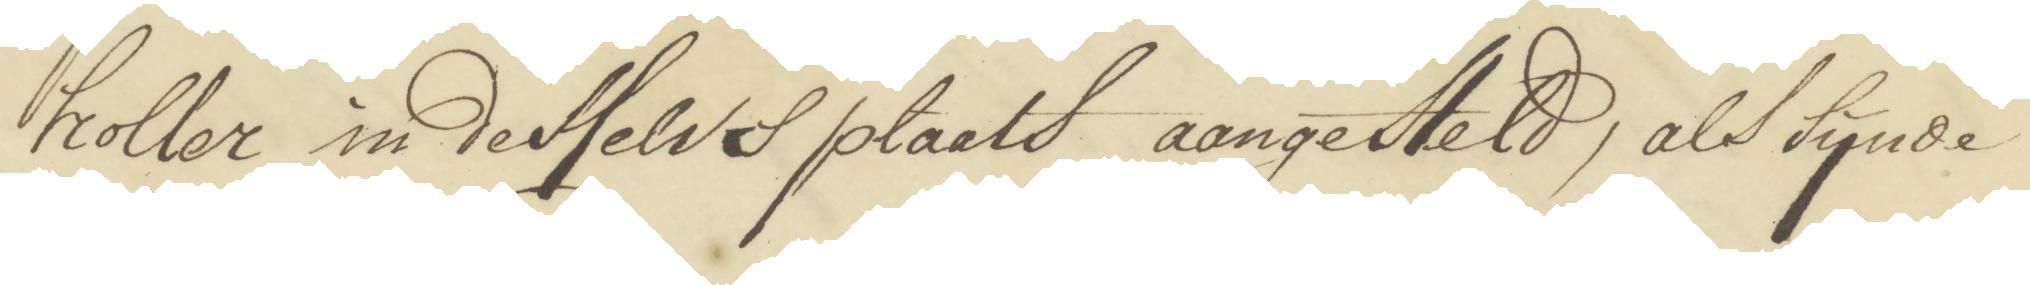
koller in desselvs plaats aangesteld, als sijnde
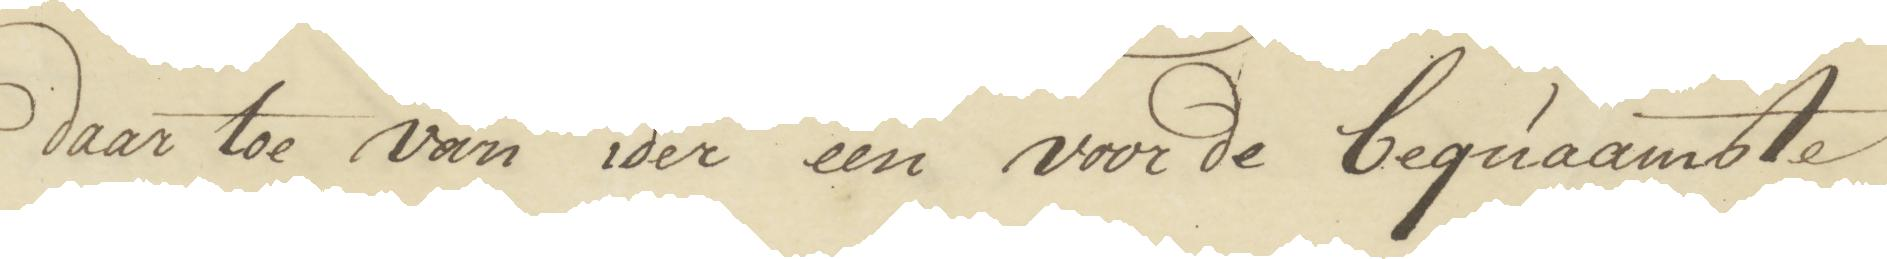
daar toe van ider een voor de bequaamste
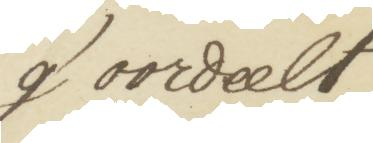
g’oordeelt
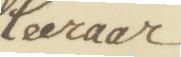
leeraar
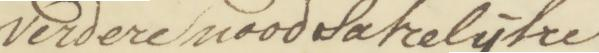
verdere noodsakelijke
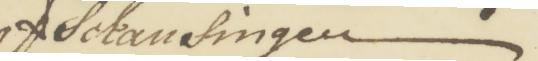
verschansingen
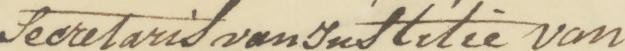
secretaris van Iustitie van
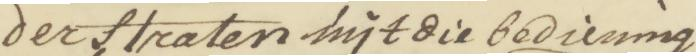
der straten uijt die bediening
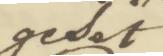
geset
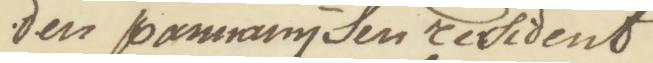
den pannanijsen resident
